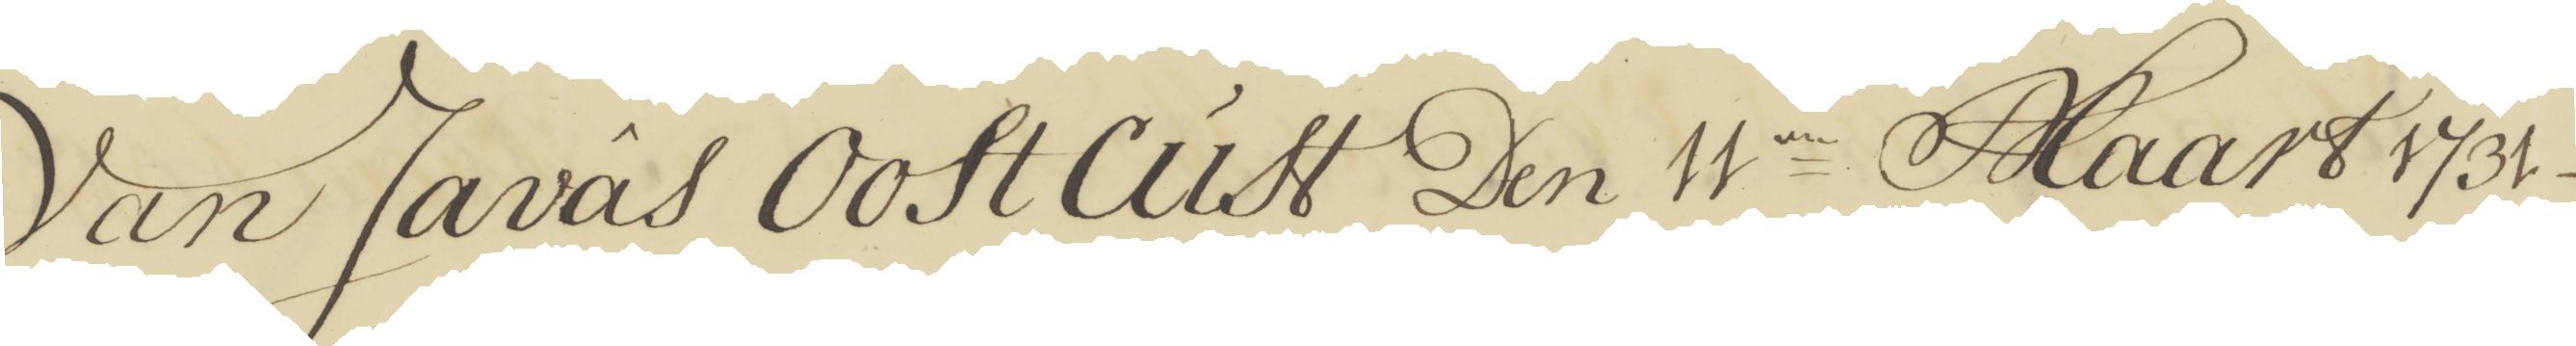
Van Javâs Oost Cust Den 11=en Maart 1731.
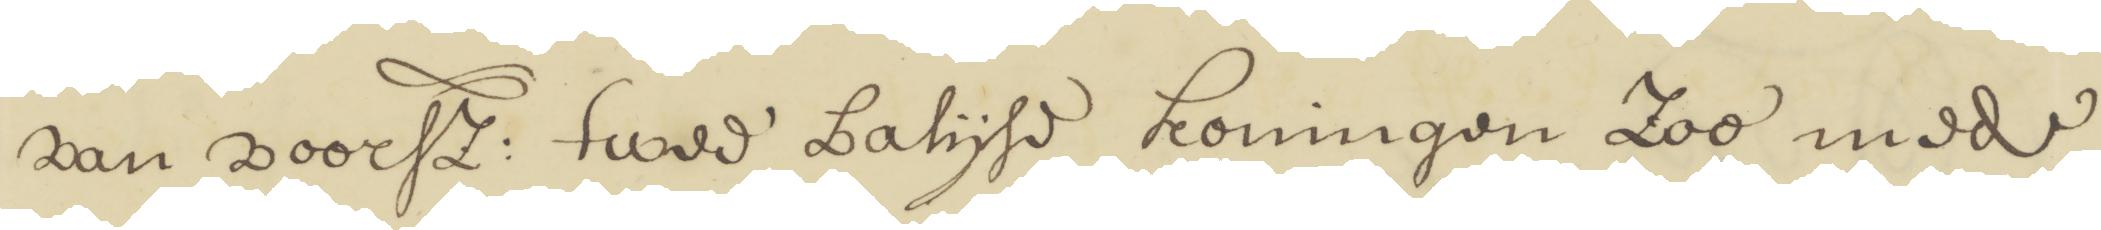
van voorsz: twee balijse koningen zoo mede
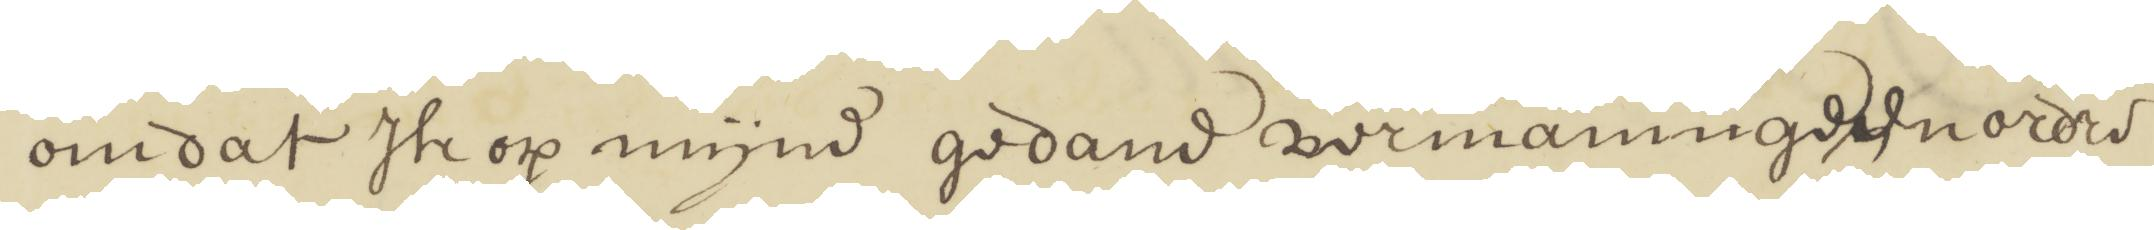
omdat Jk op mijne gedane vermaninge en ordre
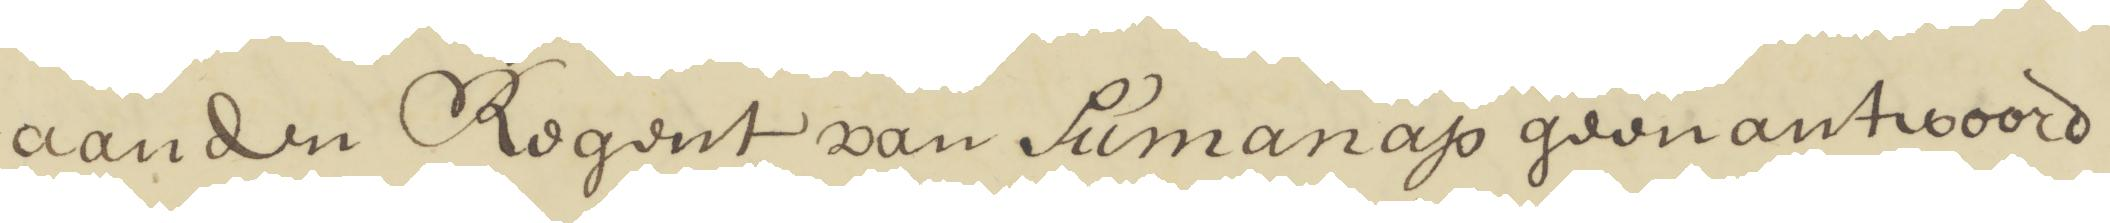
aan den Regent van Sumanap geen antwoord
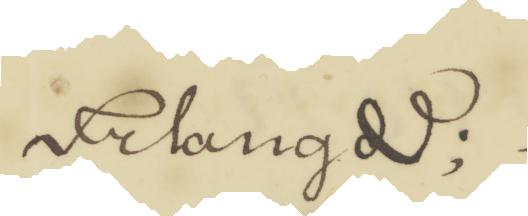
Erlangde;
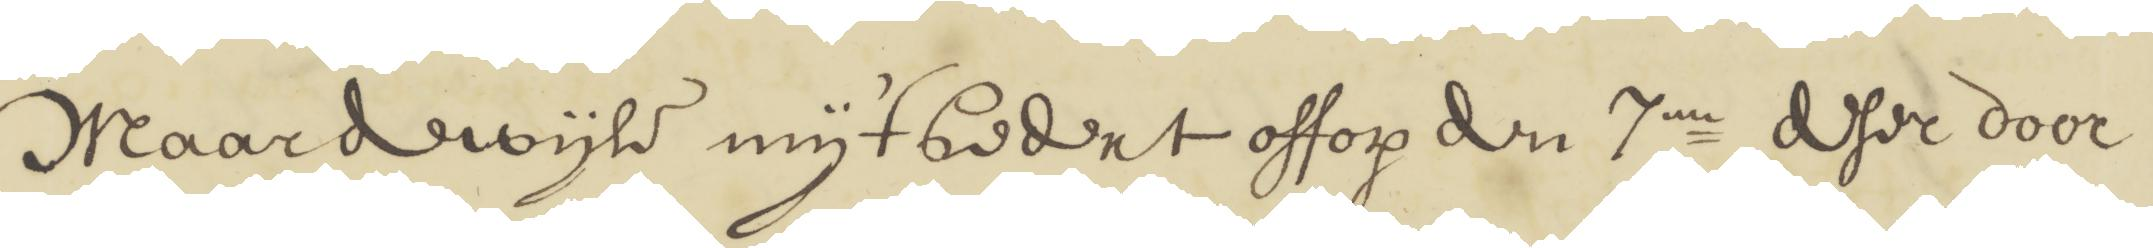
Maar dewijle mij 't sedert off op den 7=en deser door
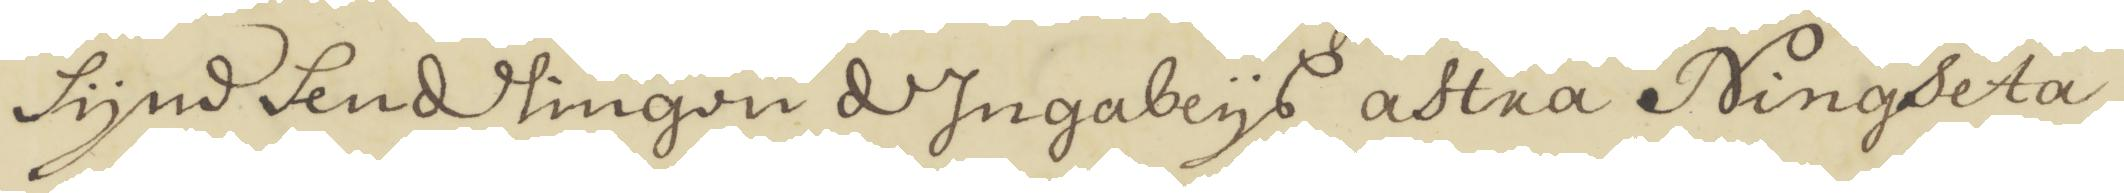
sijne sendelingen de Jngabeijs astra Ningseta,
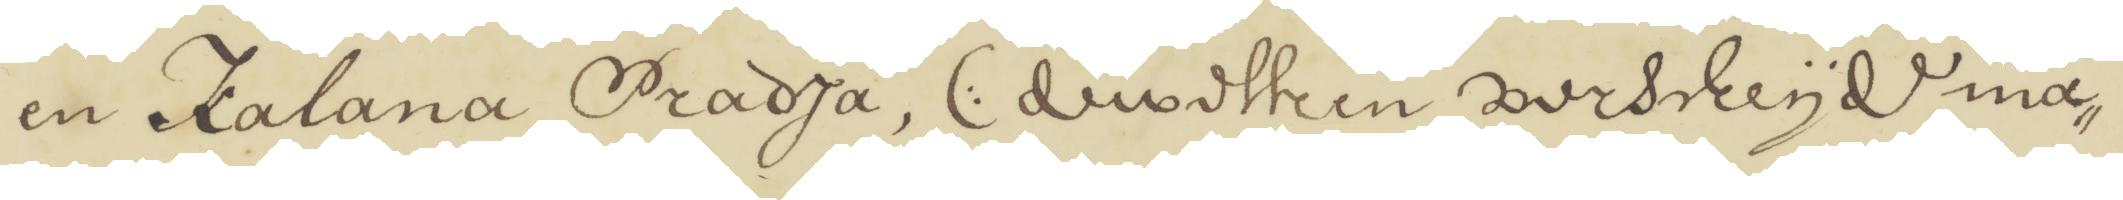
en Kalana Pradja, (:dewelken verscheijde ma„
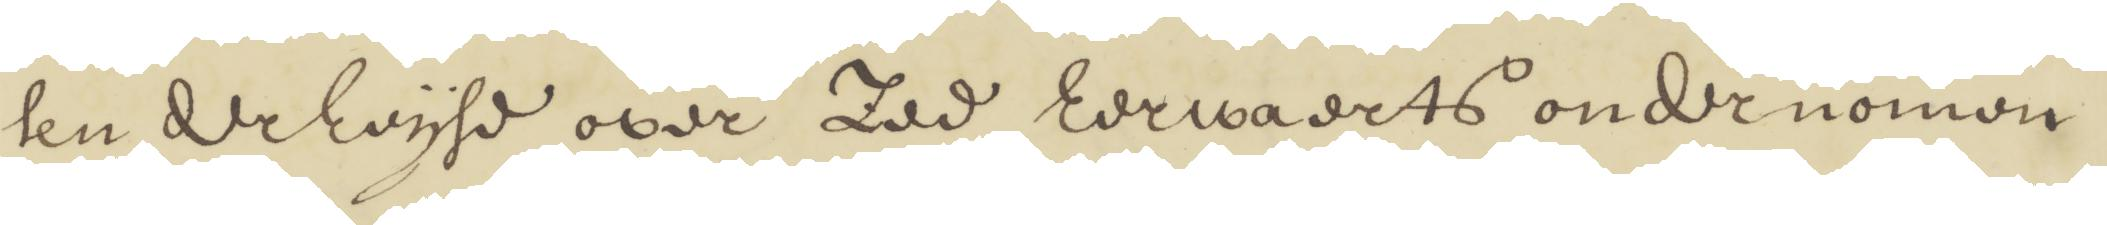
len derheijse over Zee herwaerts ondernomen
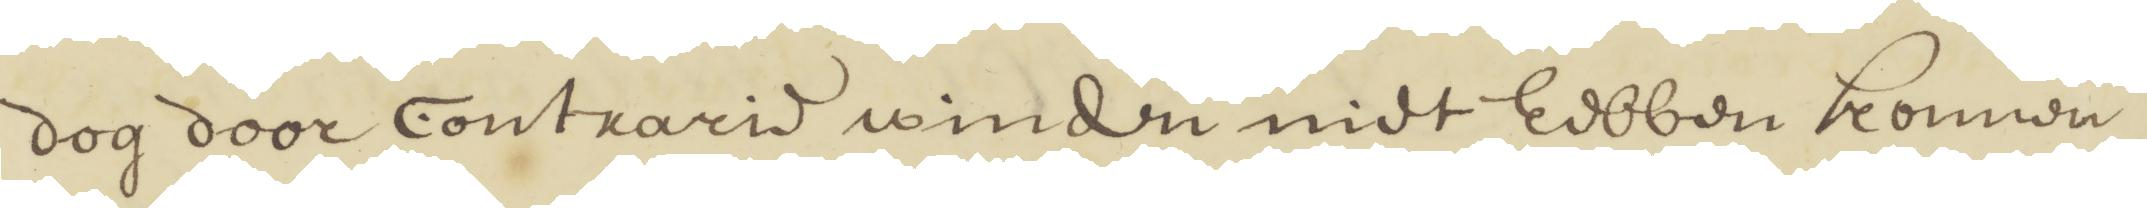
dog door contrarie winden niet hebben konnen
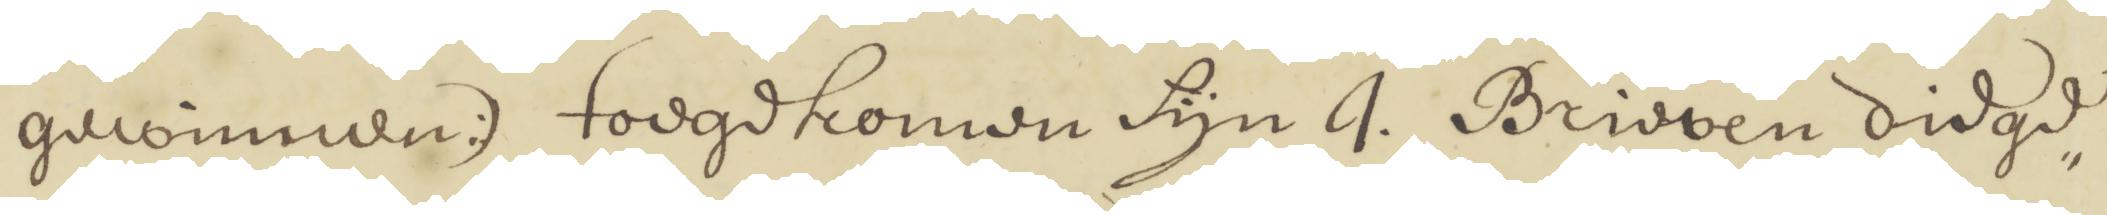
gewinnen:) toegekomen sijn 4. Brieven diege„
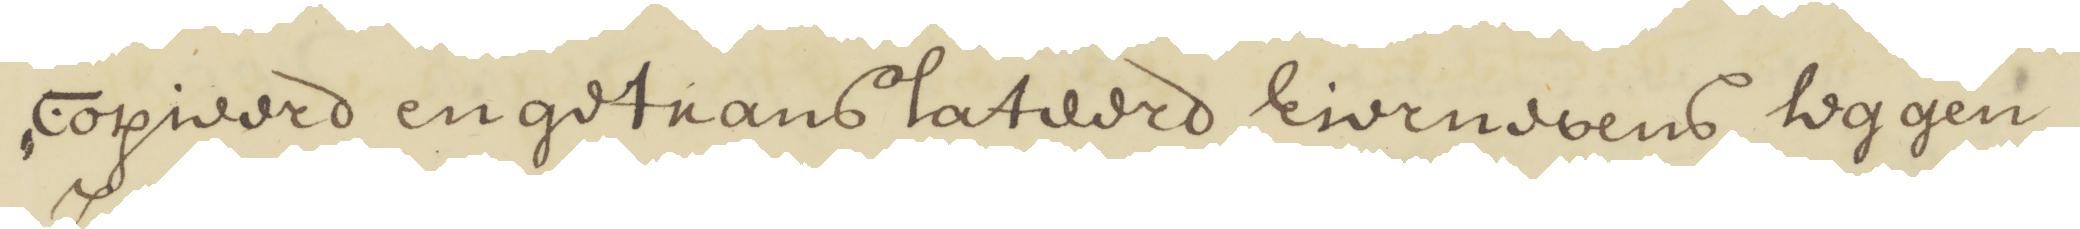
„copieerd en getranslateerd hiernevens leggen
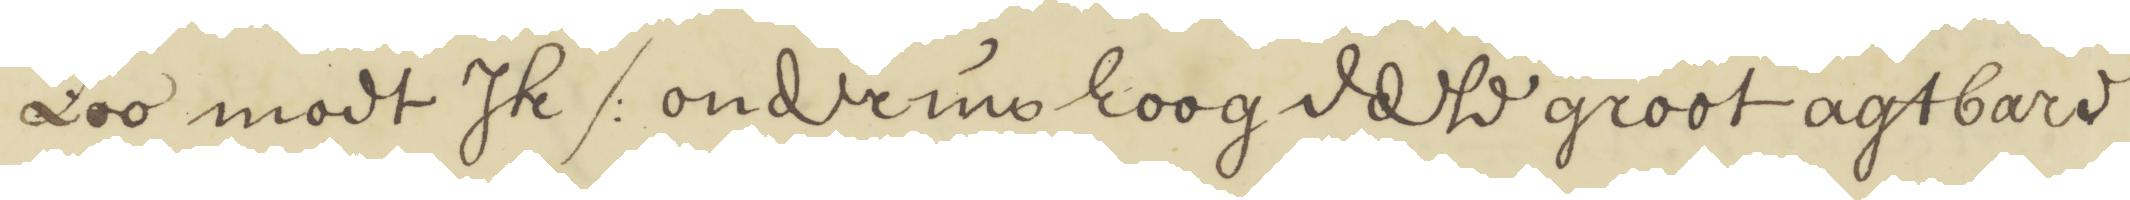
Zoo moet Jk /:onder uw hoog edele groot agtbare
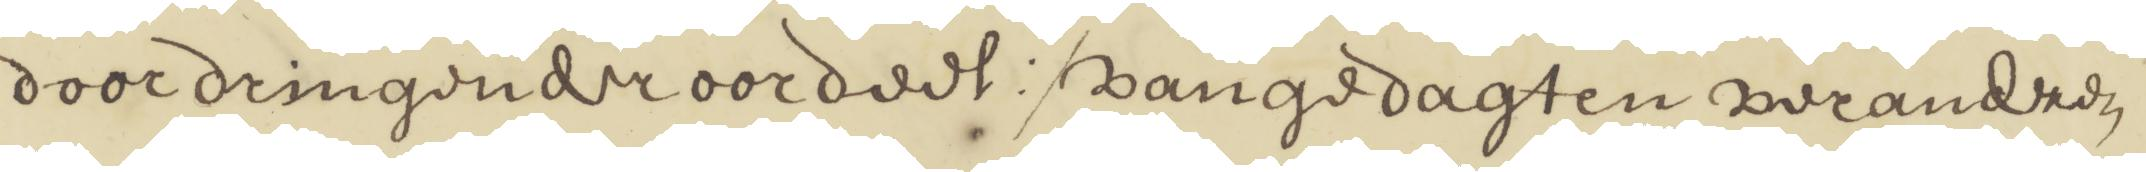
doordringender oordeel:/ van gedagten veranderen
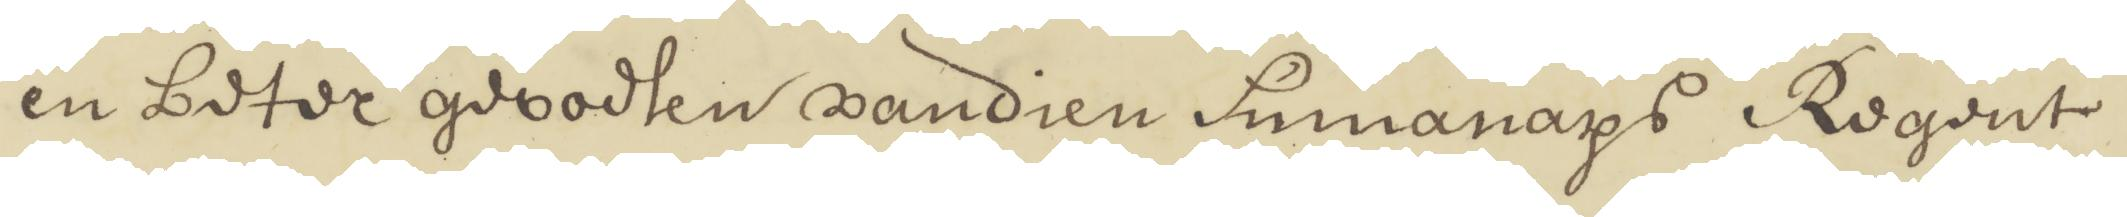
en beter gevoelen vandien sumanaps Regent
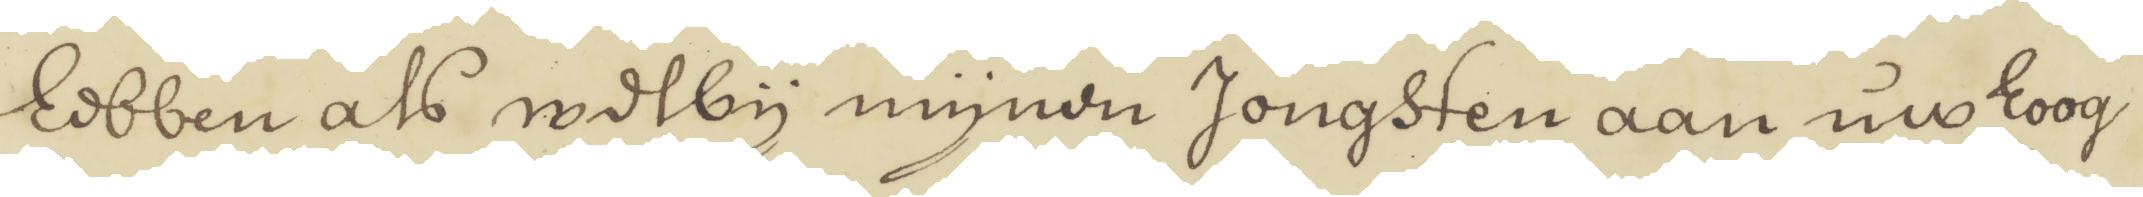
hebben als welbij mijnen Jongsten aan uw hoog
